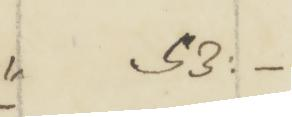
„ 53: —
